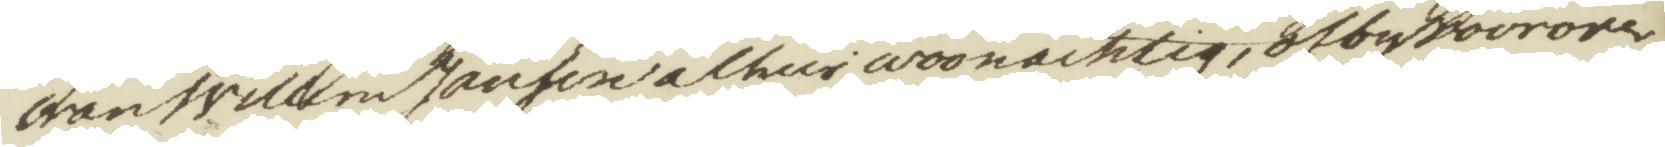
van Willem Jansen alhier woonachtig, of by voorover
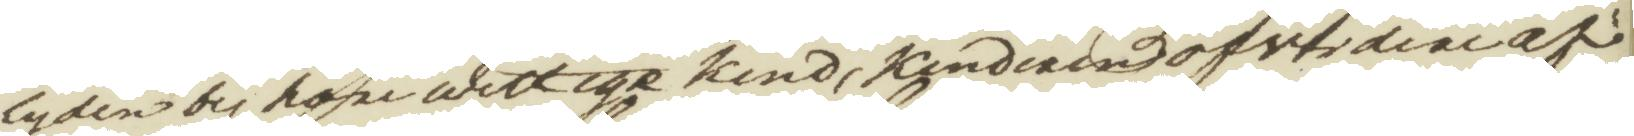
lyden by hare wettige kind, kinderen of verdere af:
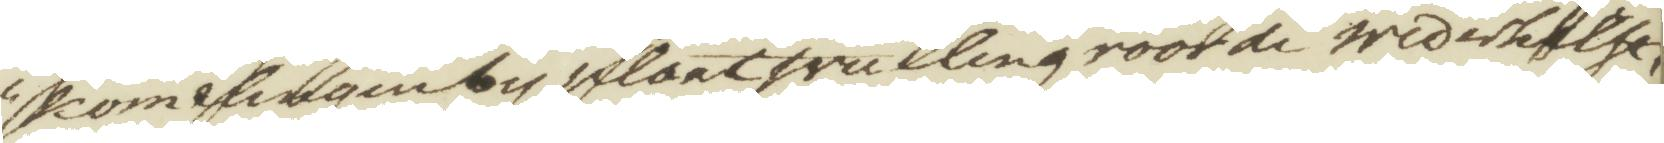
komelingen by plaatsvulling voor de wederhelft
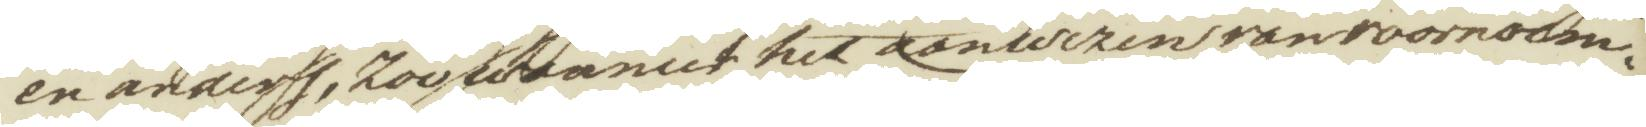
en anders, zoo wanneer het aanwezen van voornoem„
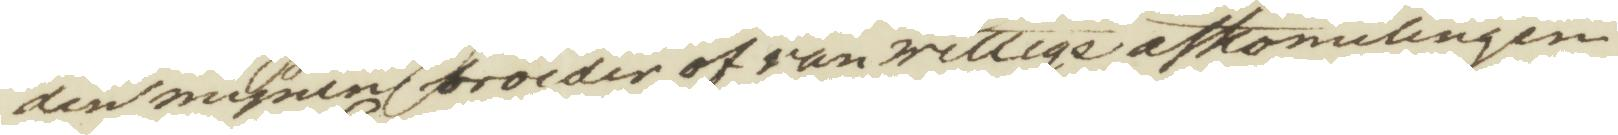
den mijnen broeder of van wettige afkomelingen
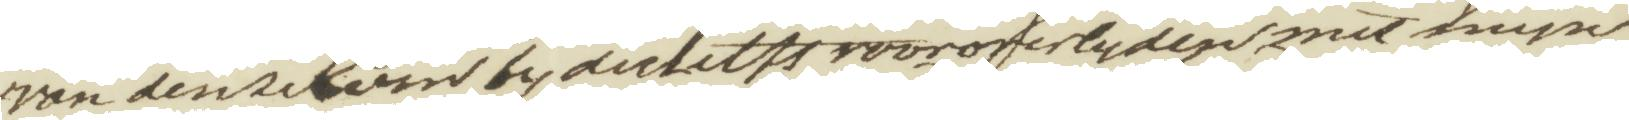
van denzelven by deszelfs vooroverlyden met myn
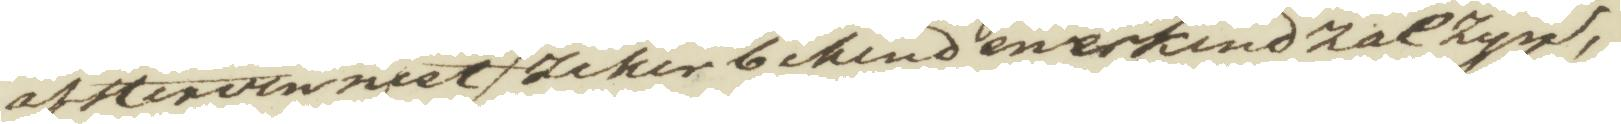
afsterven niet zeker bekend en erkend zal zyn,
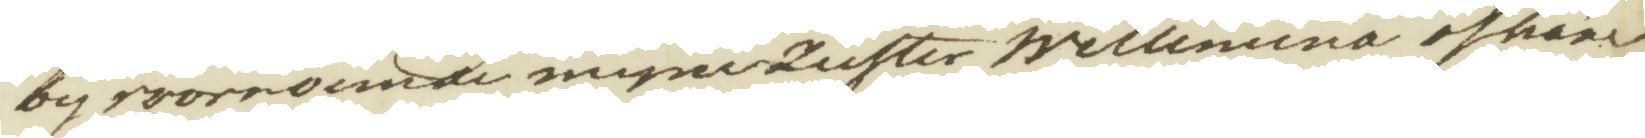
by voornoemde myne Zuster Willemina of hare
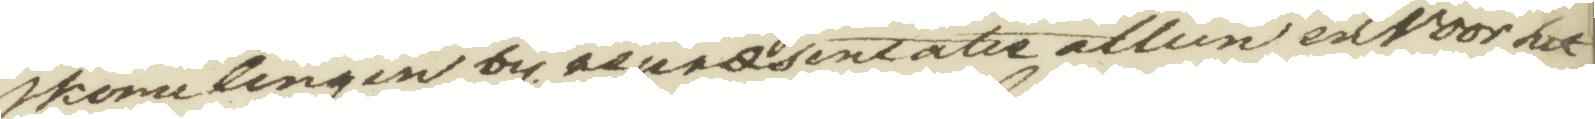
afkomelingen by representatie aleen en voor het
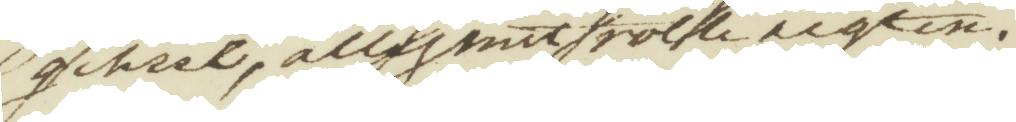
geheel, alles met volle regten.
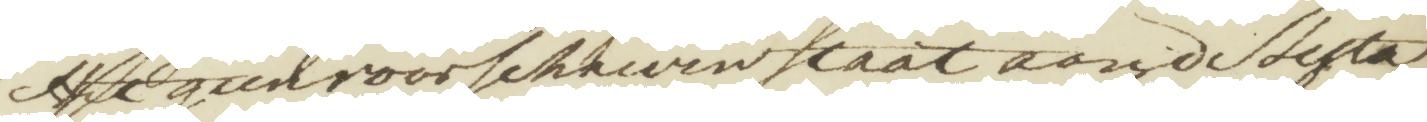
Het geen voorschreven staat aan de Testa
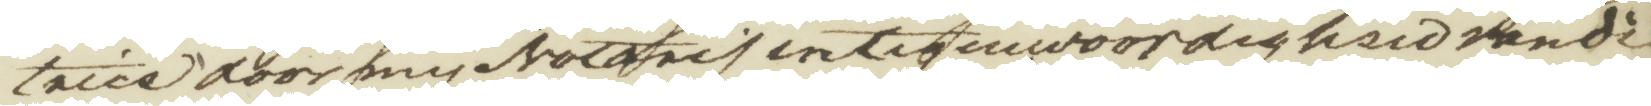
trice door my Notaris in tegenwoordigheid van de
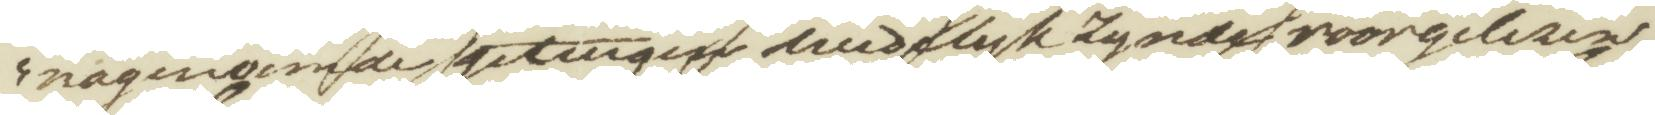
„nagenoemde getuigen duidelyk zynde voorgelezen
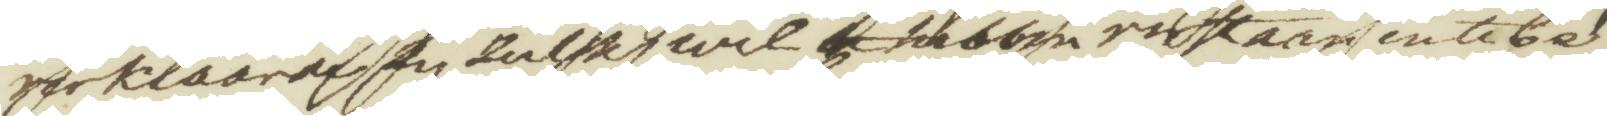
verklaarde zy zulks wel te hebben verstaan en te be
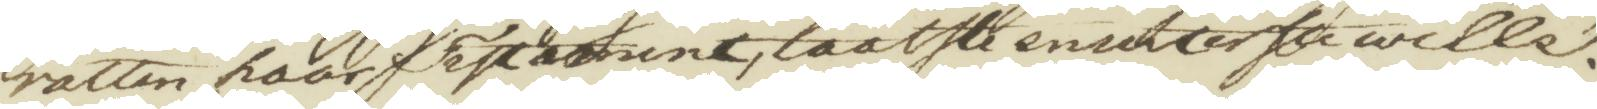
vatten haar Testament, laatste en uiterste wille
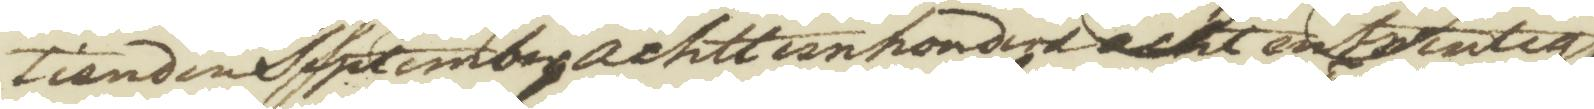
tienden September achttienhonderd acht en twintig
